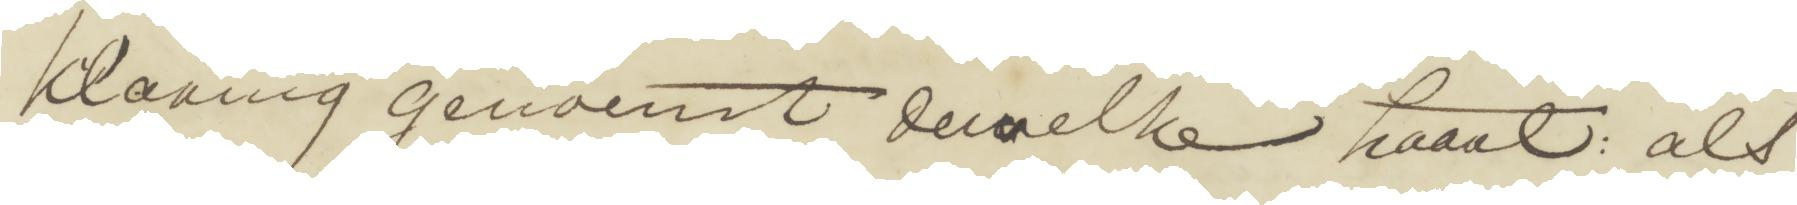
klaring genoemt dewelke haarl: als
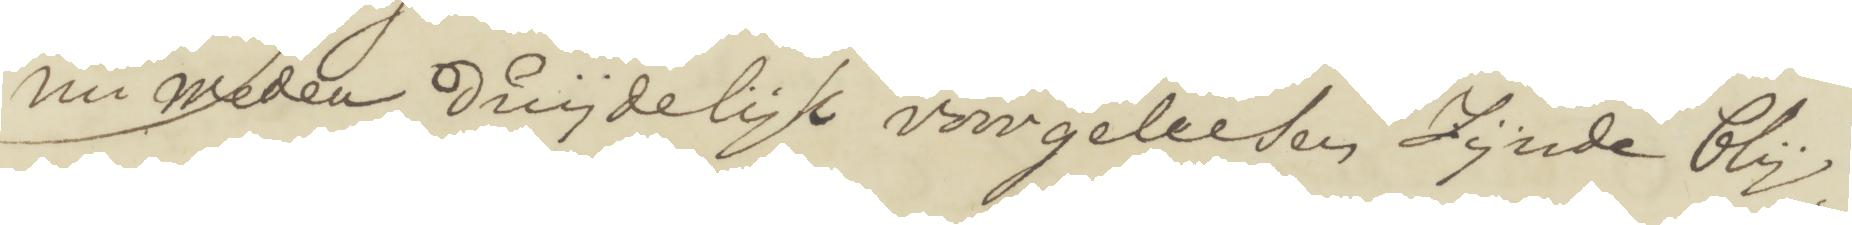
nu weder duijdelijk voorgeleesen zijnde blij„
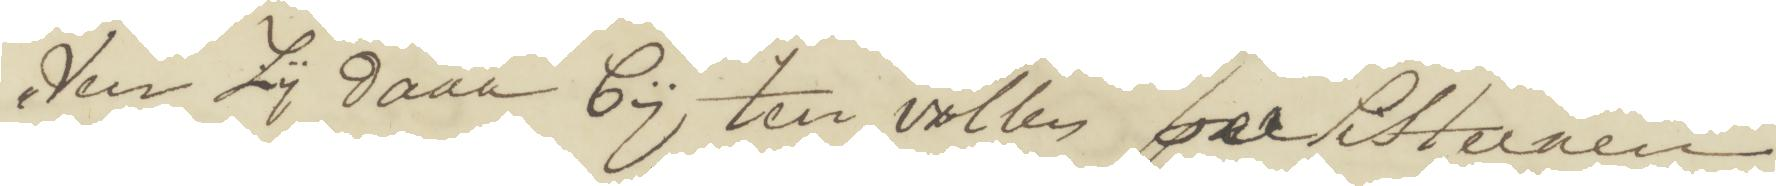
ven zij daar bij ten vollen persisteeren
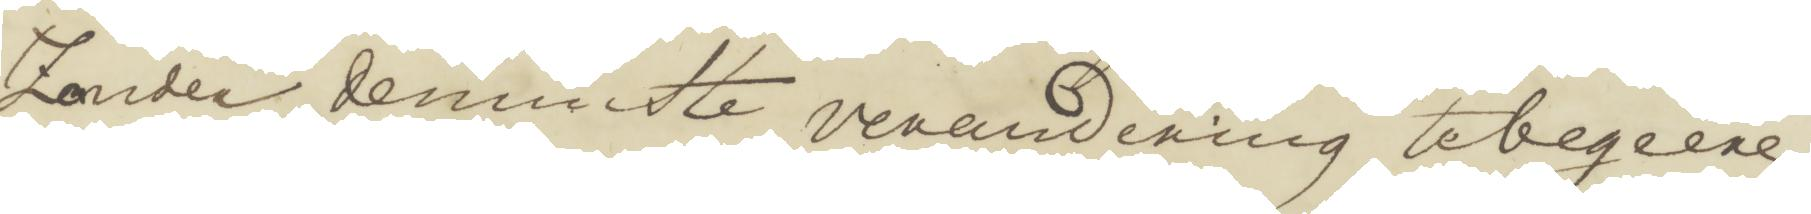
zonder de minste verandering te begeeren
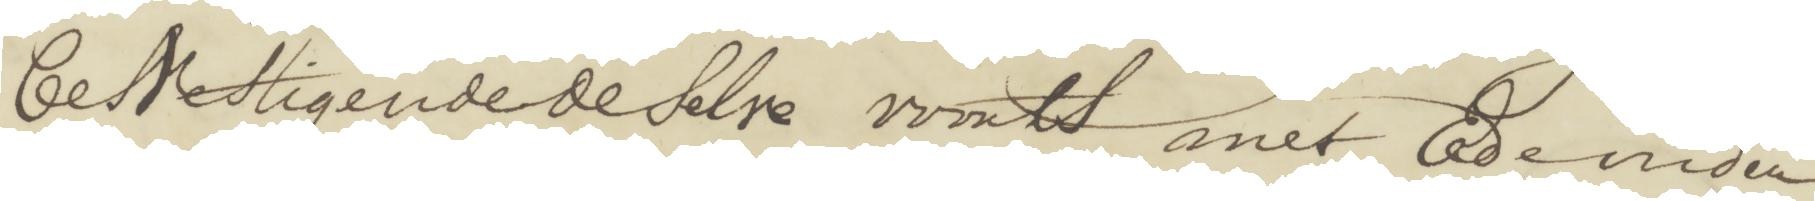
bevestigende deselve voorts met Eede onder
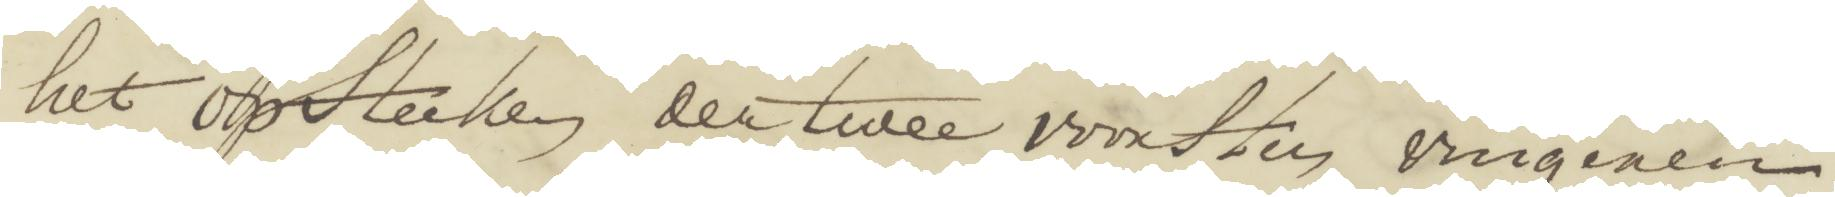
het opsteeken der twee voorsten vingeren
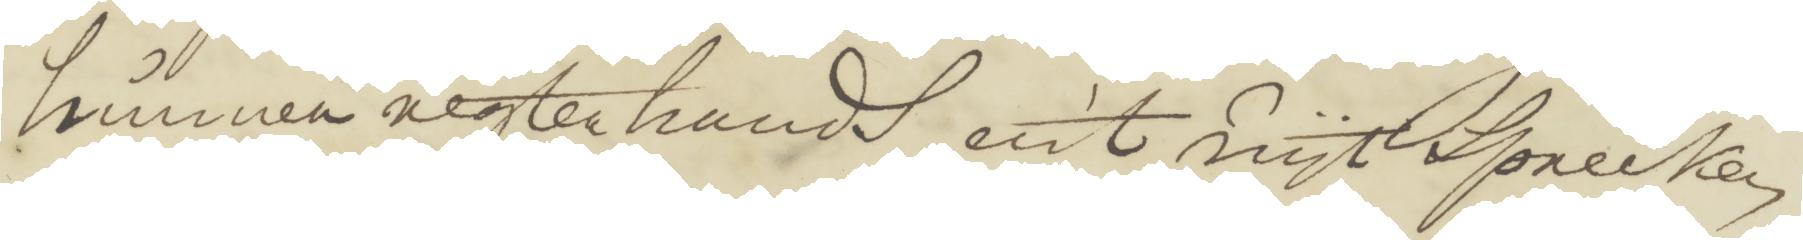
hunner regterhands, en’t uijt spreeken
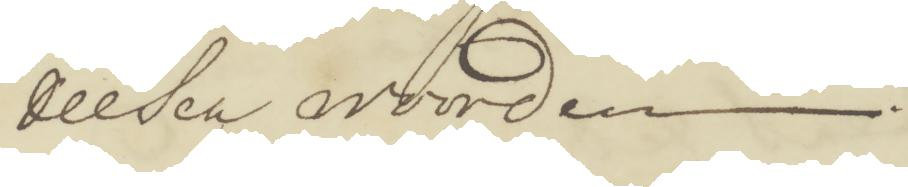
deeser woorden
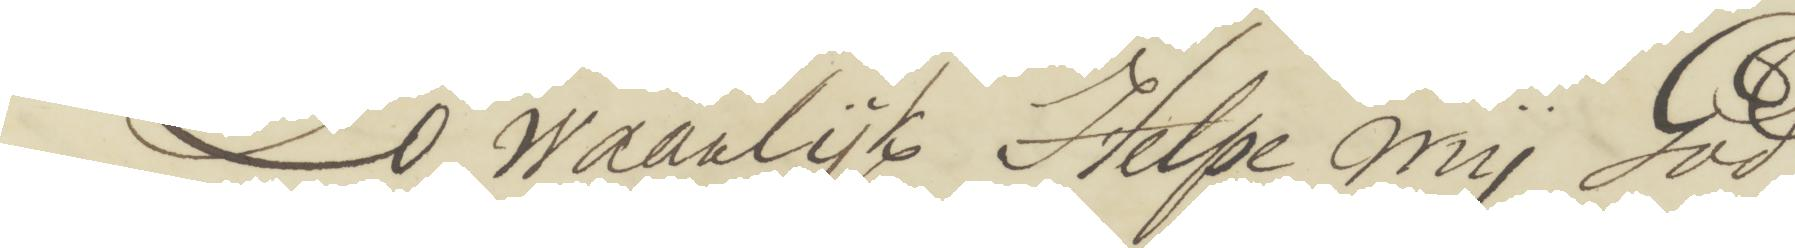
Zo waarlijk Helpe mij God
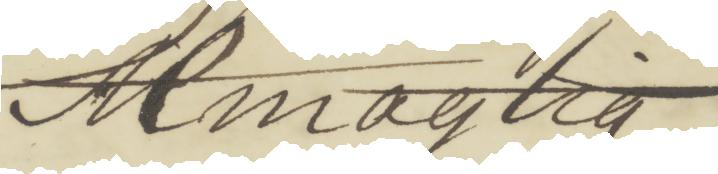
Almagtig.
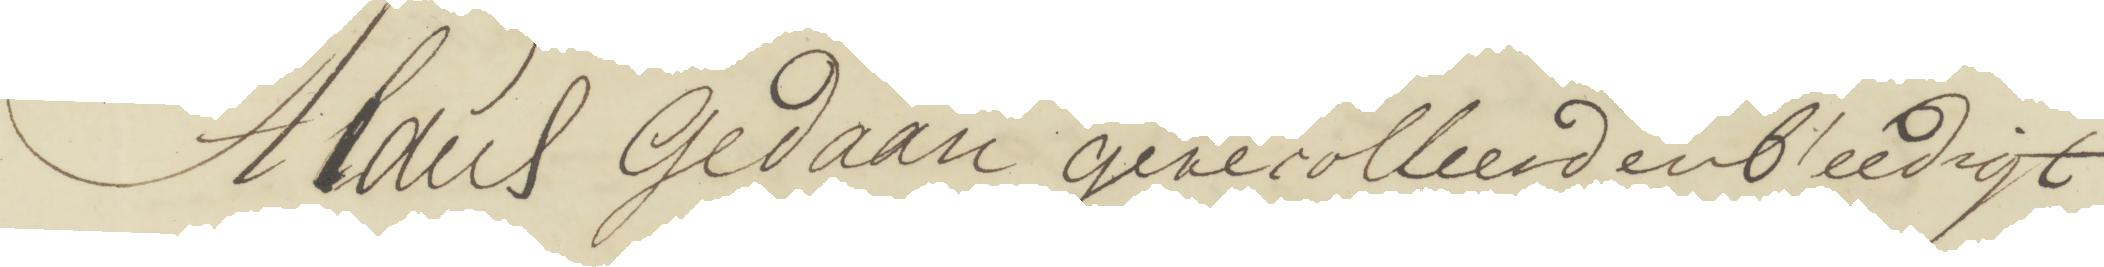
Aldus Gedaan gerecolleerd en b'eedigt
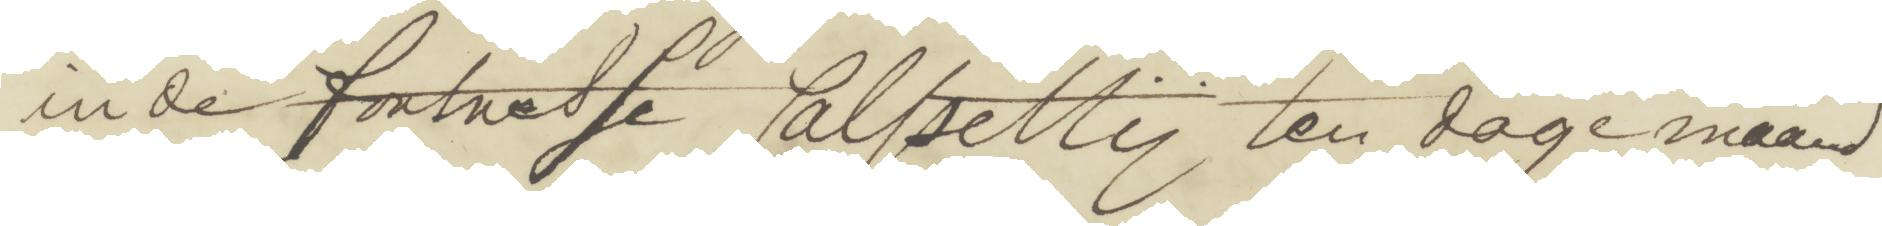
in de fortresse Calpettij ten dage maand
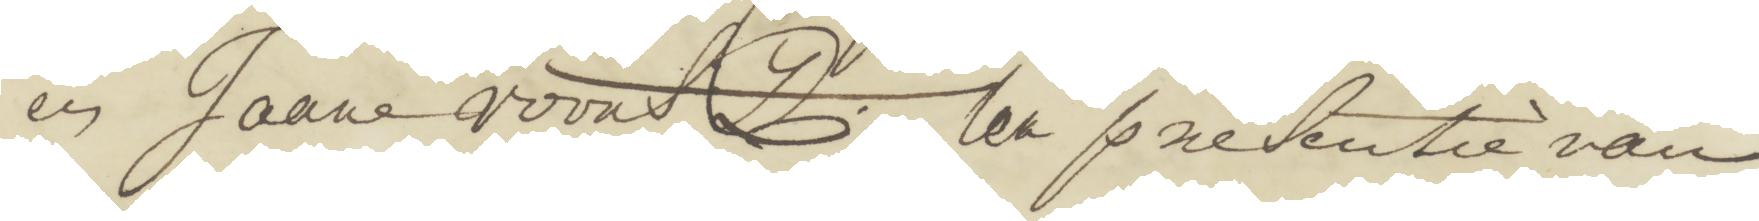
en Jaare voorsz: ter presentie van
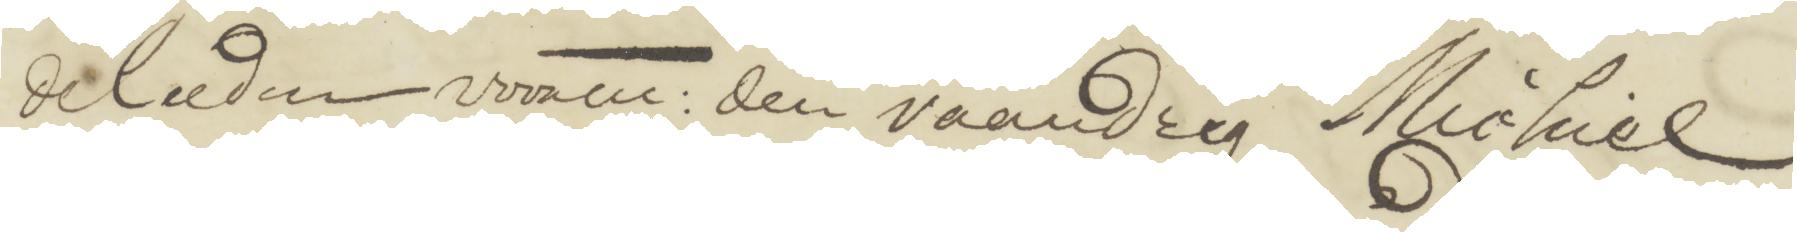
de lieden vorm: den vaandrig Michiel
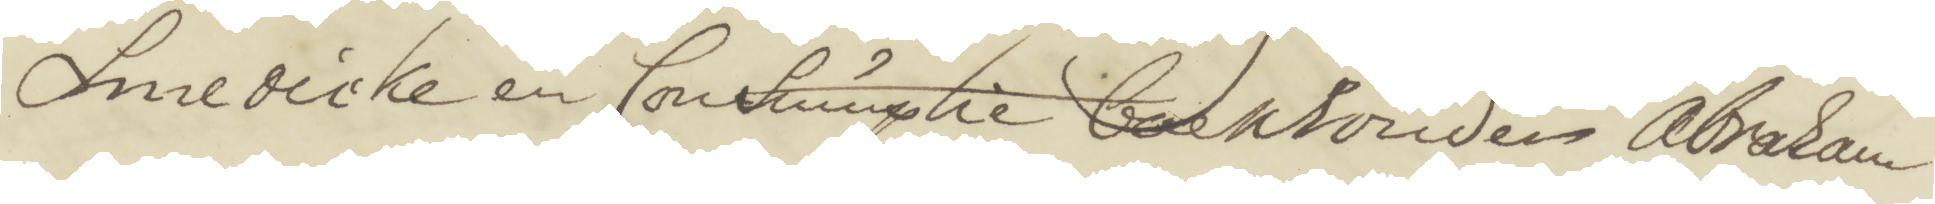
Smedicke en Consumptie boekhouder abraham
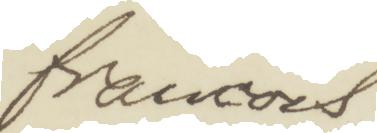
francois
